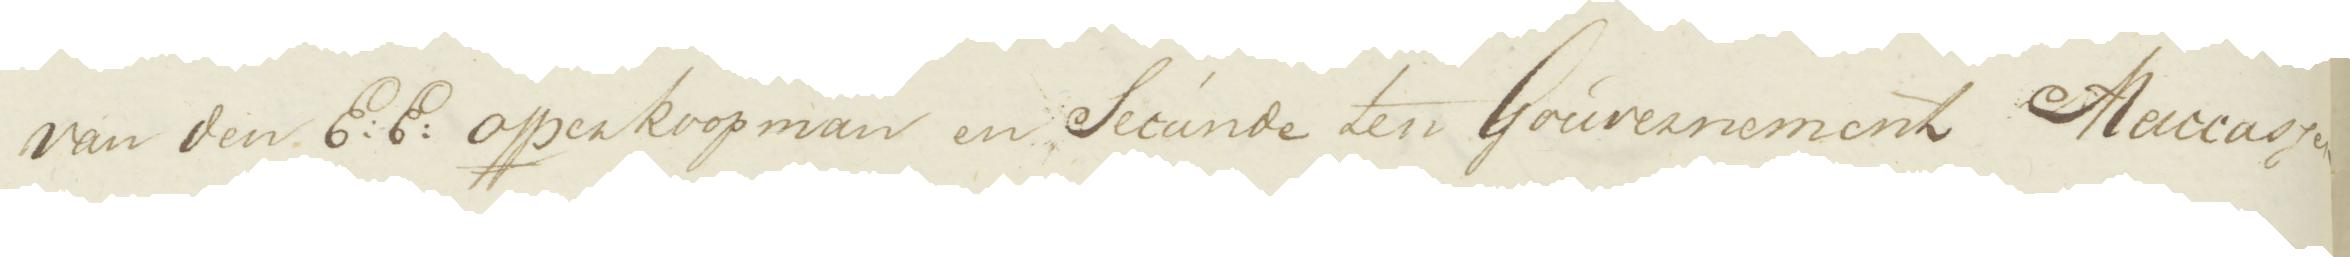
van den E: E: opperkoopman en Secunde ten Gouvernement Maccasser
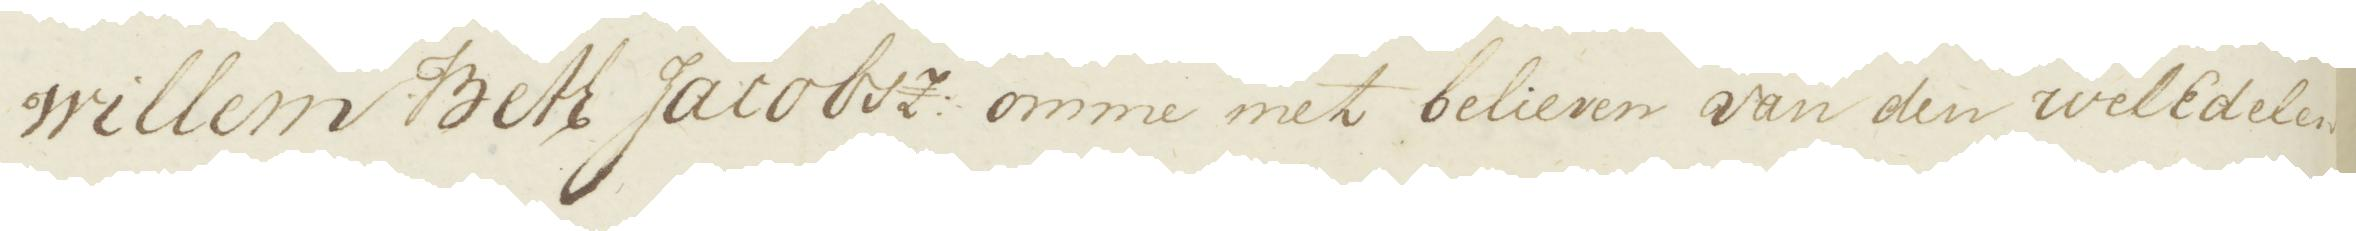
Willem Beth Jacobsz: omme met believen van den welEdelen
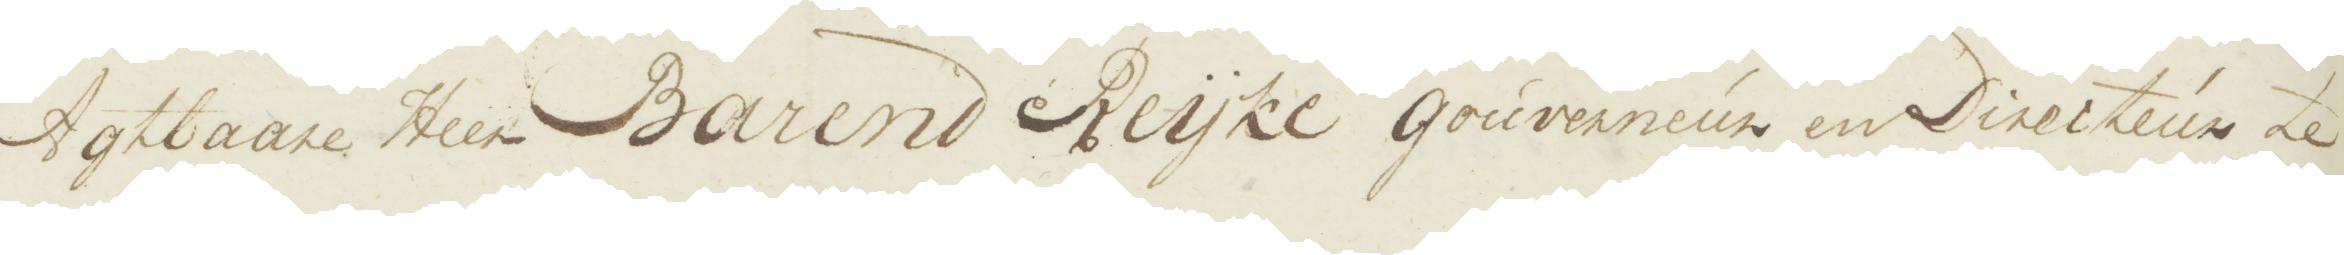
Agtbaare Heer Barend Reijke gouverneur en Directeur te
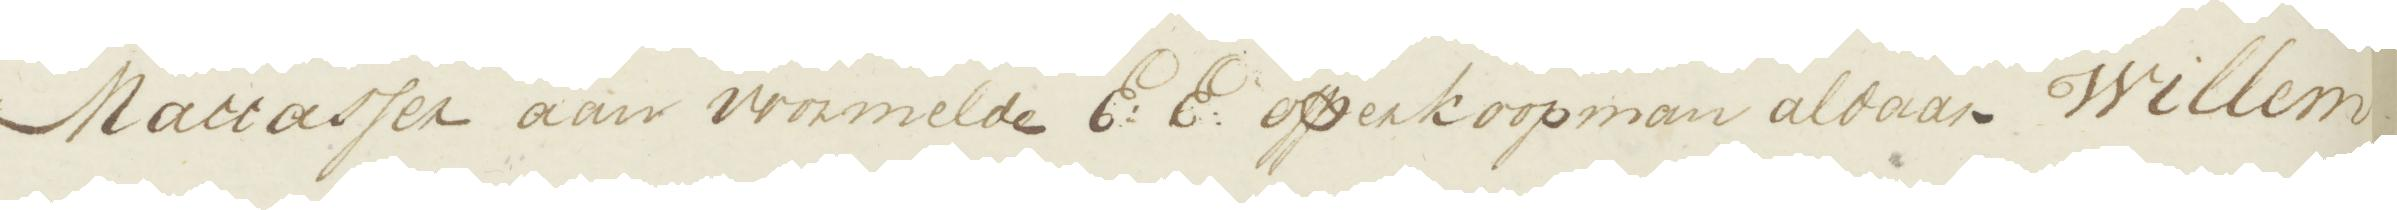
Maccasser aan voormelde E: E: opperkoopman aldaar Willem
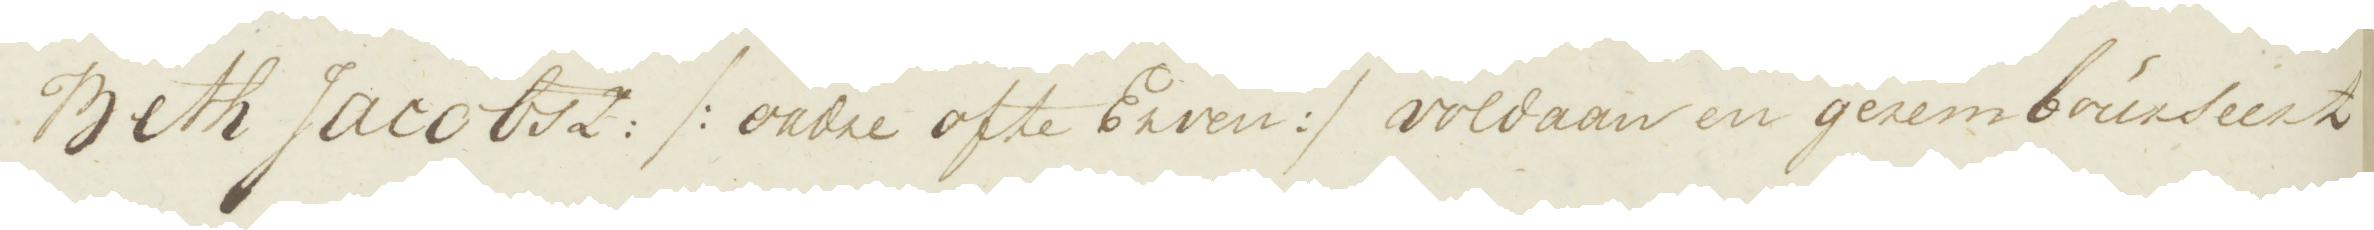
Beth Jacobsz: /: ordre ofte Erven :/ voldaan en gerembourseert
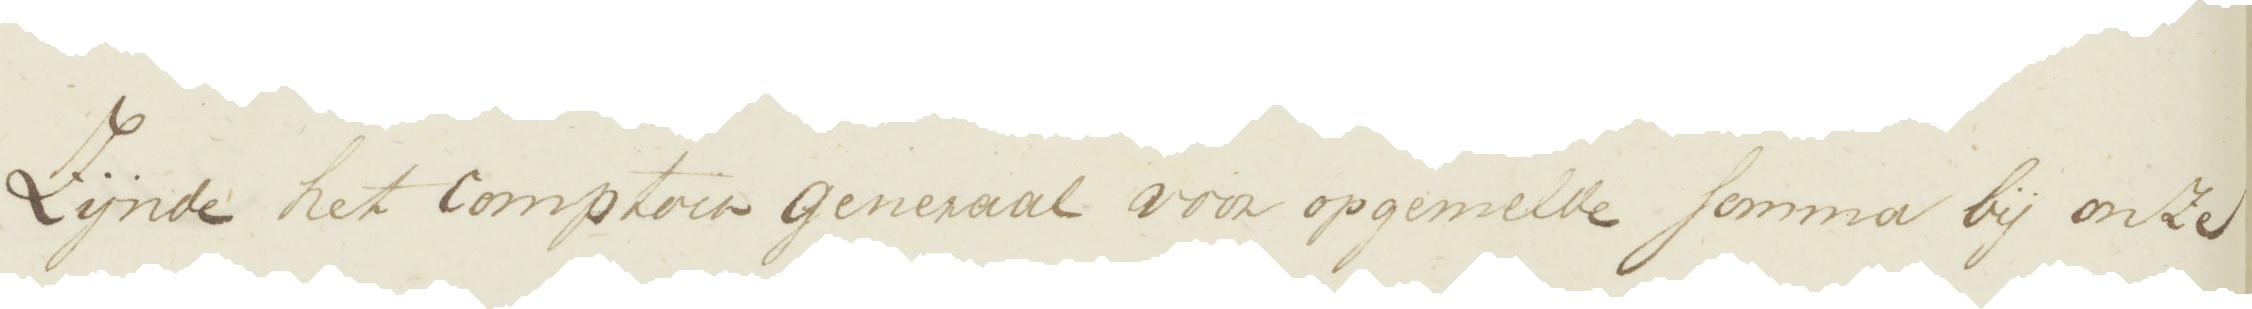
Zijnde het comptoir generaal voor opgemelde somma bij onze
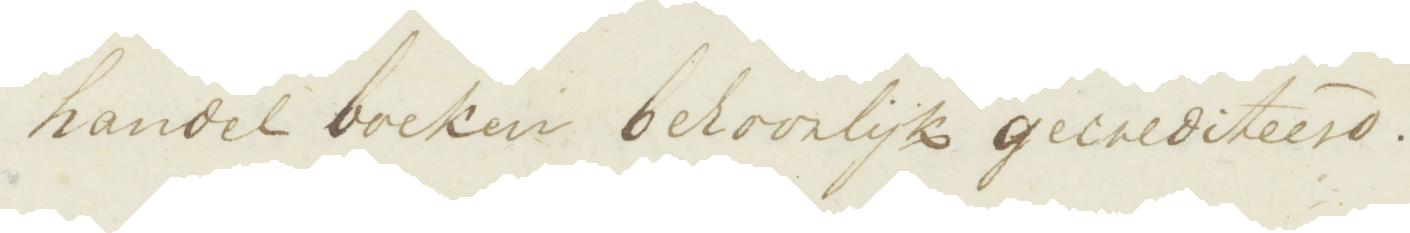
handel boeken behoorlijk gecrediteerd
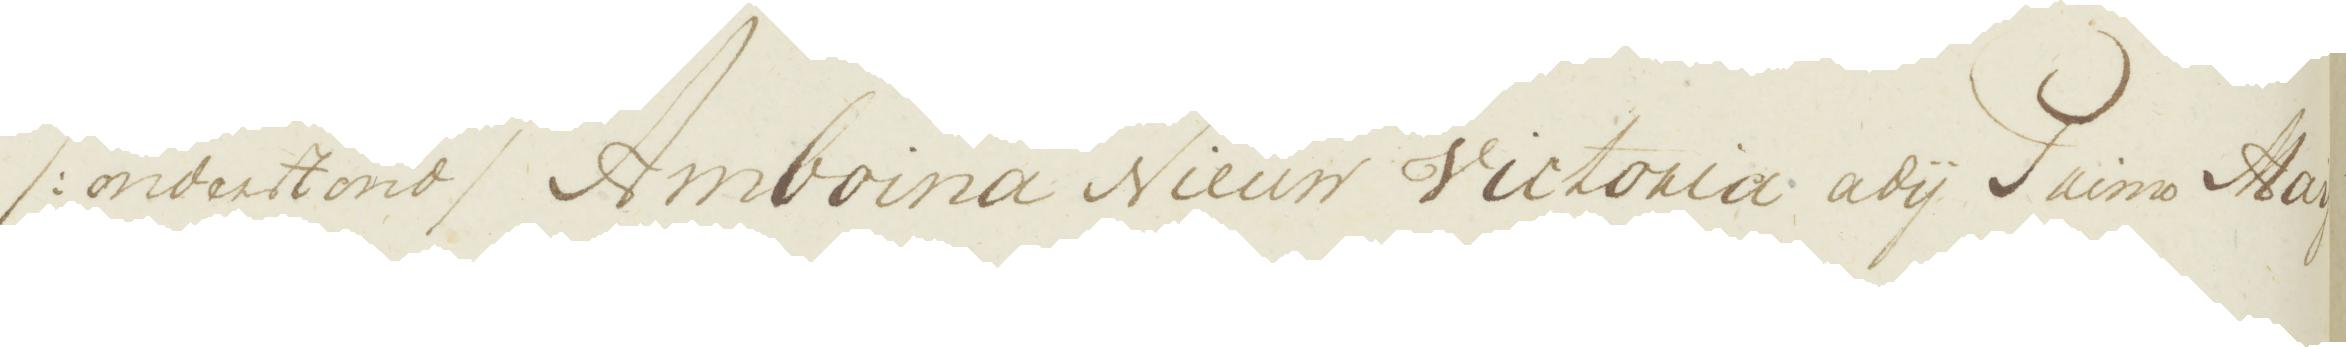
/: onderstond:/ Amboina Nieuw Victoria adij Primo Mai
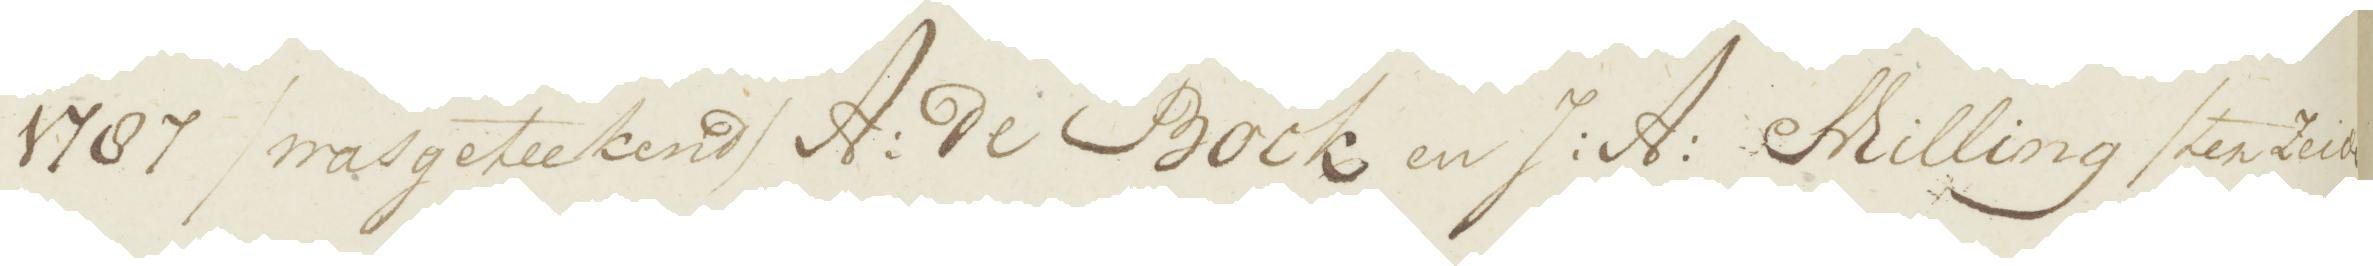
1787 / was geteekend / A: de Boek en J: A: Schilling / ter zeid
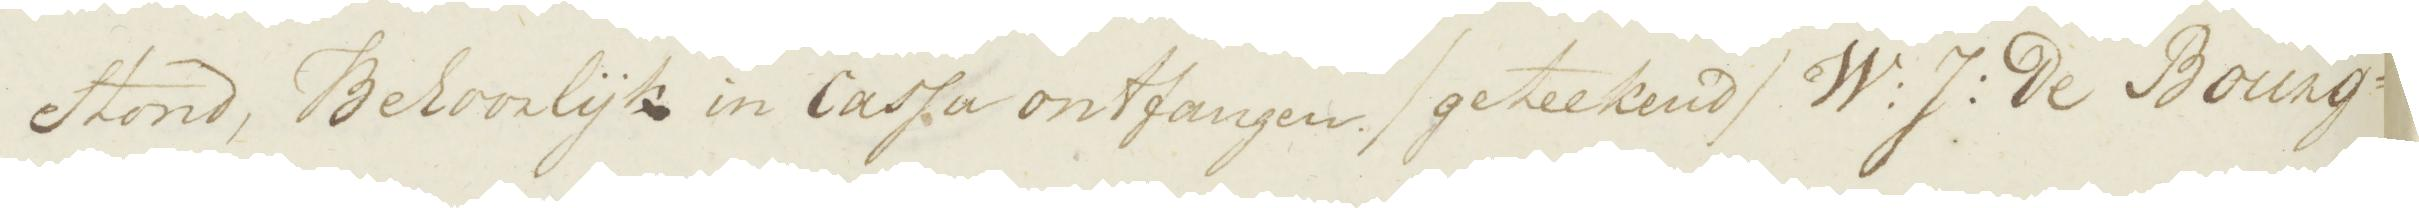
stond, Behoorlijk in cassa ontfangen. / geteekend / W: J: de Bourg=
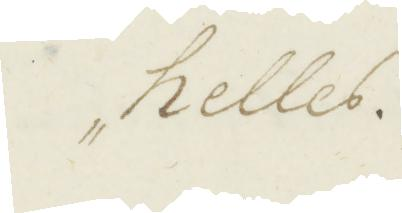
=helles.
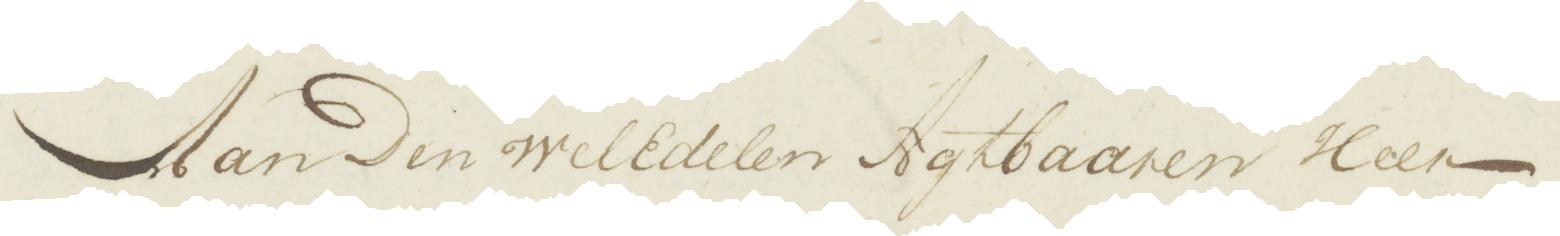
Aan Den welEdelen Agtbaaren Heer
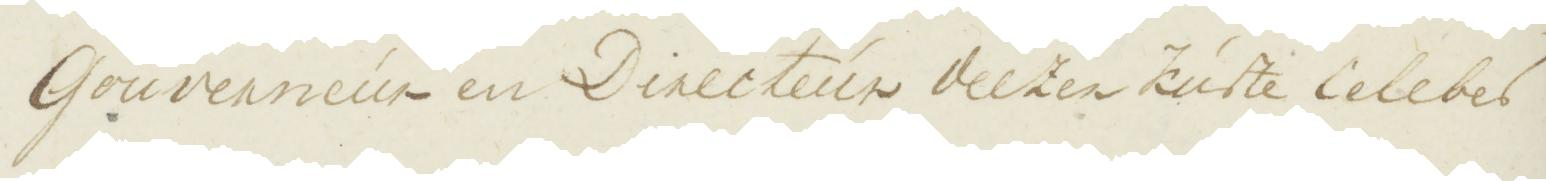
Gouverneur en Directeur deezer kuste celebes
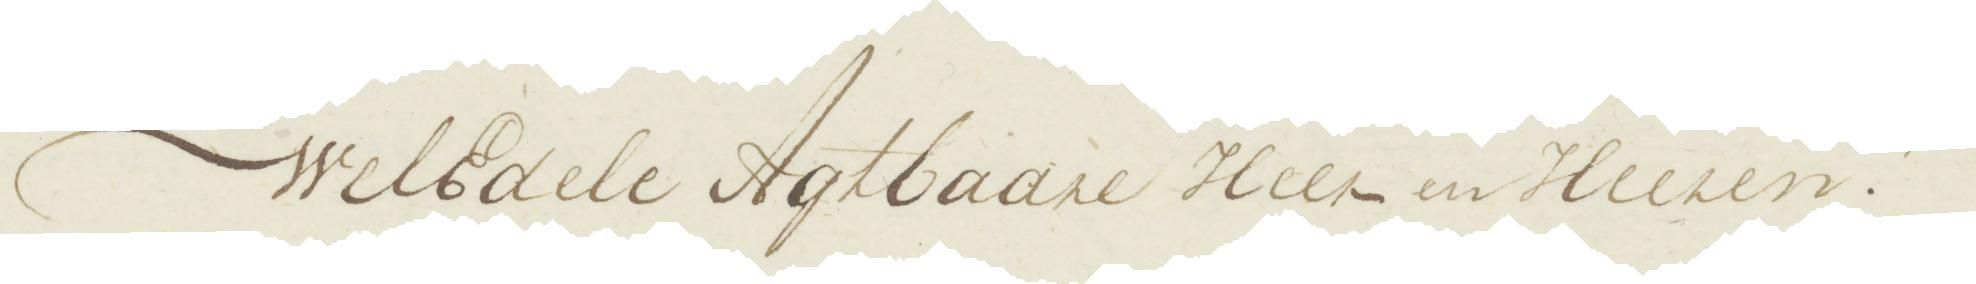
WelEdele Agtbaare Heer en Heeren!
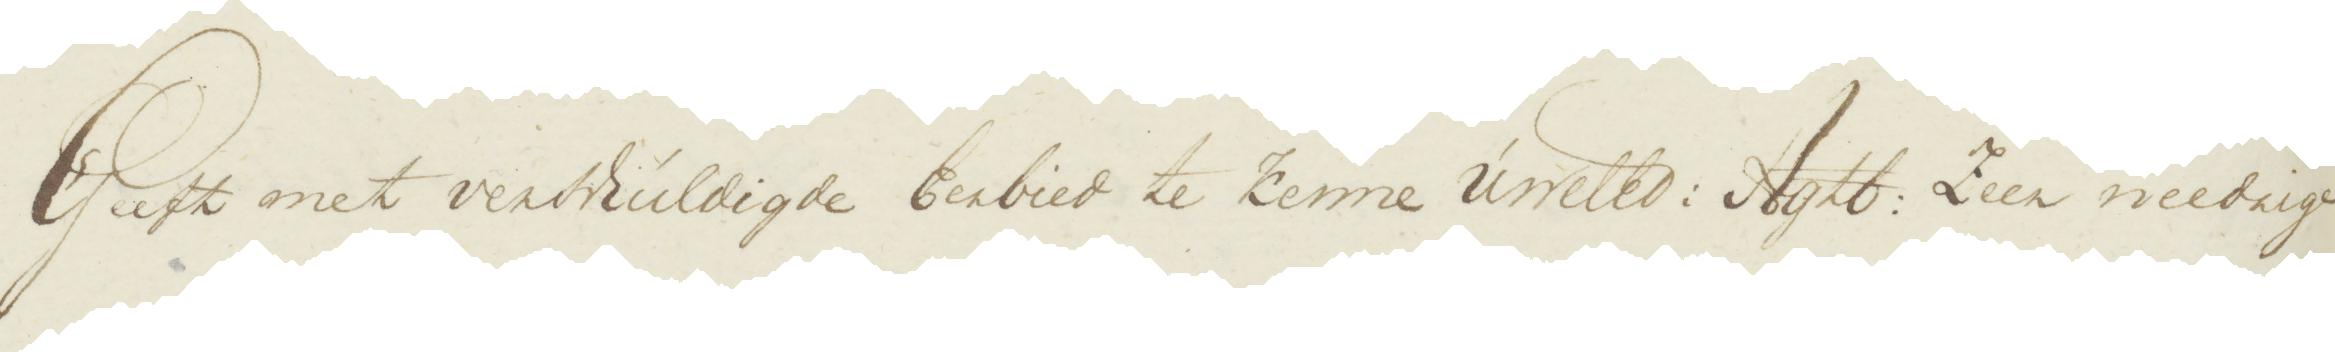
Geeft met verschuldigde Eerbied te kenne uwelEd: Agtb: zeer needrige
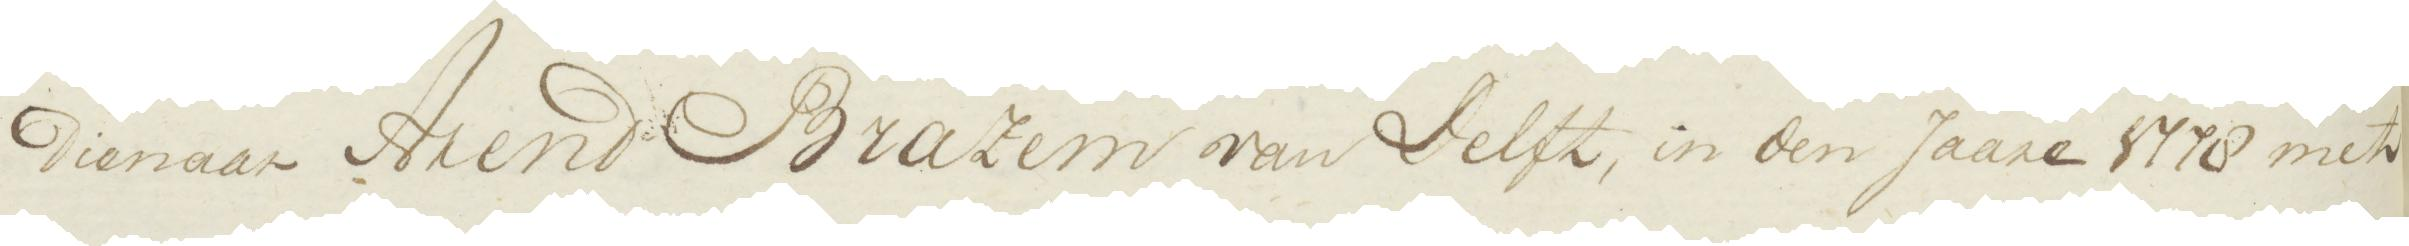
dienaar Arend: Brazem van Delft, in den Jaare 1778 met
